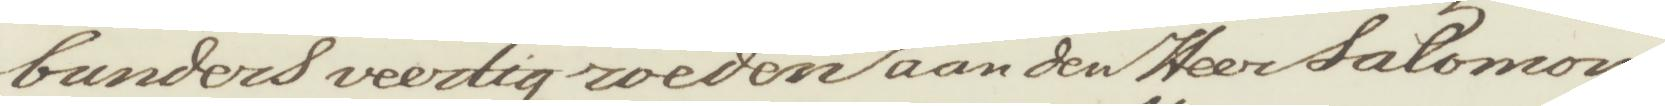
bunders veertig roeden aan den Heer Salomon
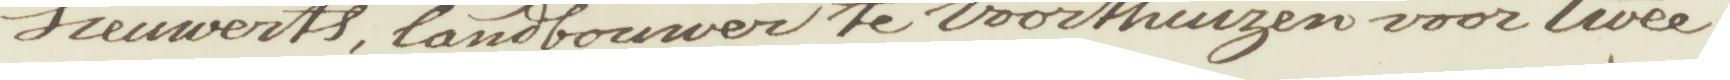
Sieuwerts, landbouwer te voorthuizen voor twee
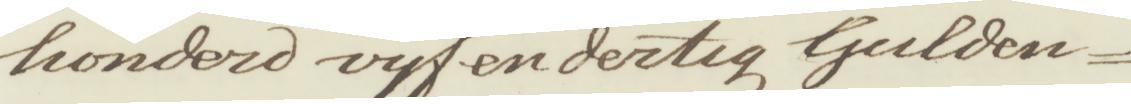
honderd vyf en dertig Gulden—
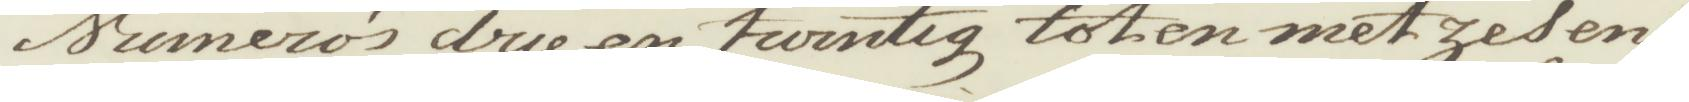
Numero's drie en twintig, tot en met zes en
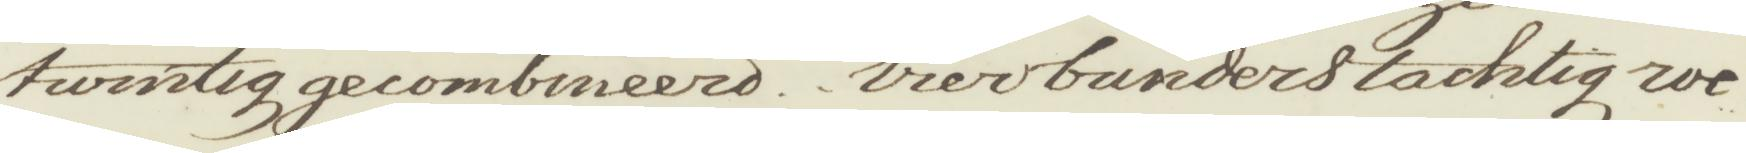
twintig gecombineerd.- vier bunders tachtig roe„
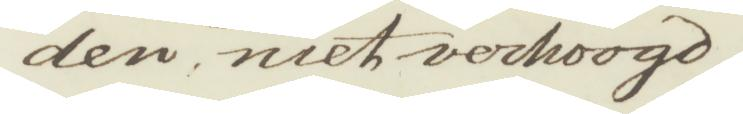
den, niet verhoogd.
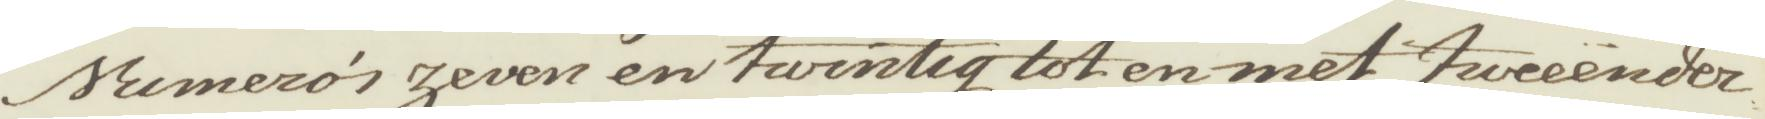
Numero's zeven en twintig tot en met tweeënder
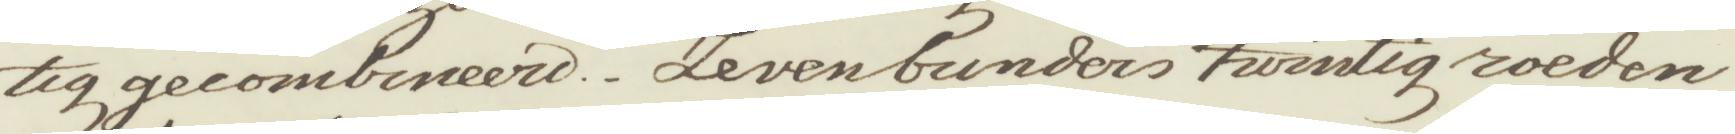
tig gecombineerd.- Zeven bunders twintig roeden
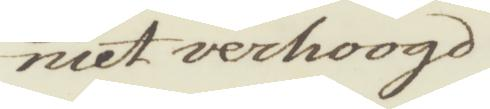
niet verhoogd
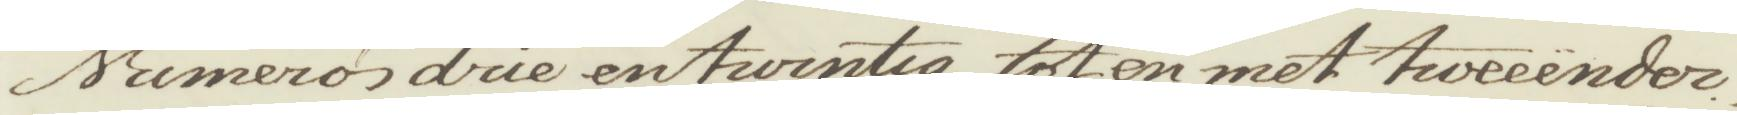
Numero's drie en twintig tot en met tweeender
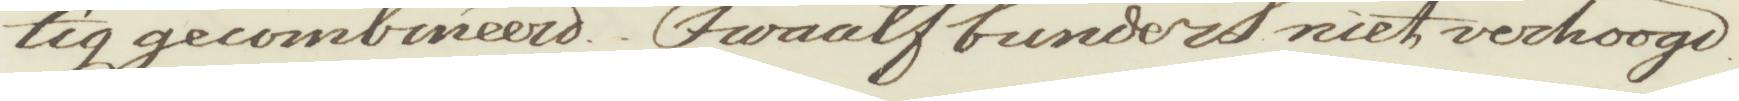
tig gecombineerd. Twaalf bunders niet verhoogd
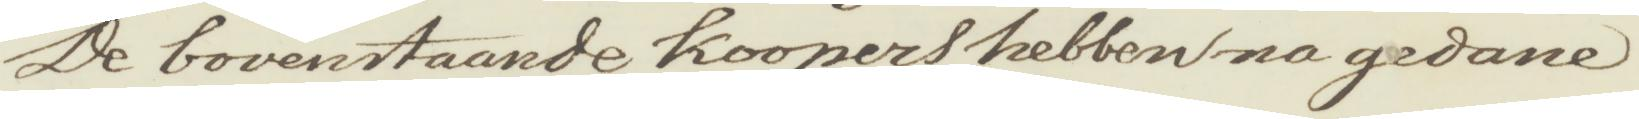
De bovenstaande koopers hebben na gedane
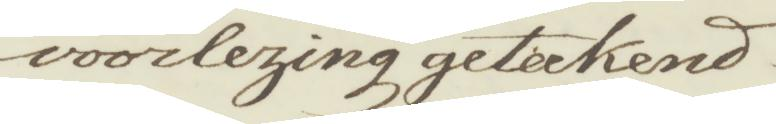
voorlezing geteekend
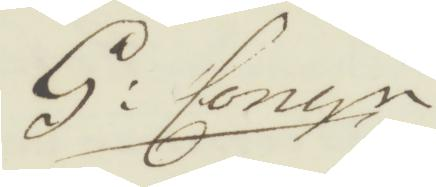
G: Conyn
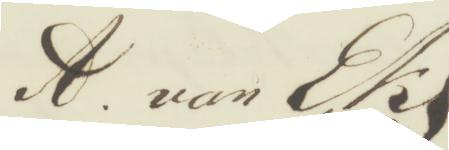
A. van Ek
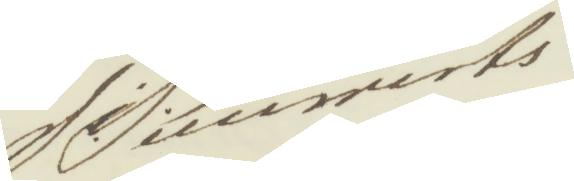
S. Sieuwerts
